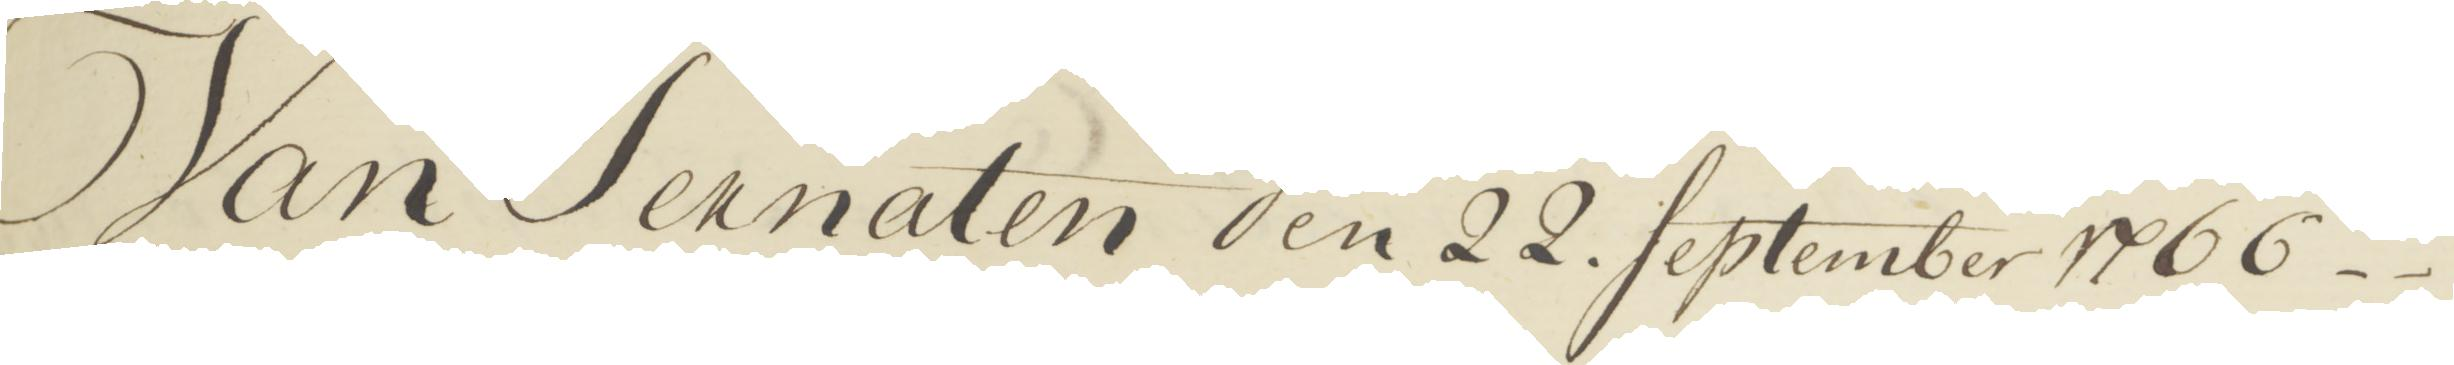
Van Ternaten den 22. september 1766 - -
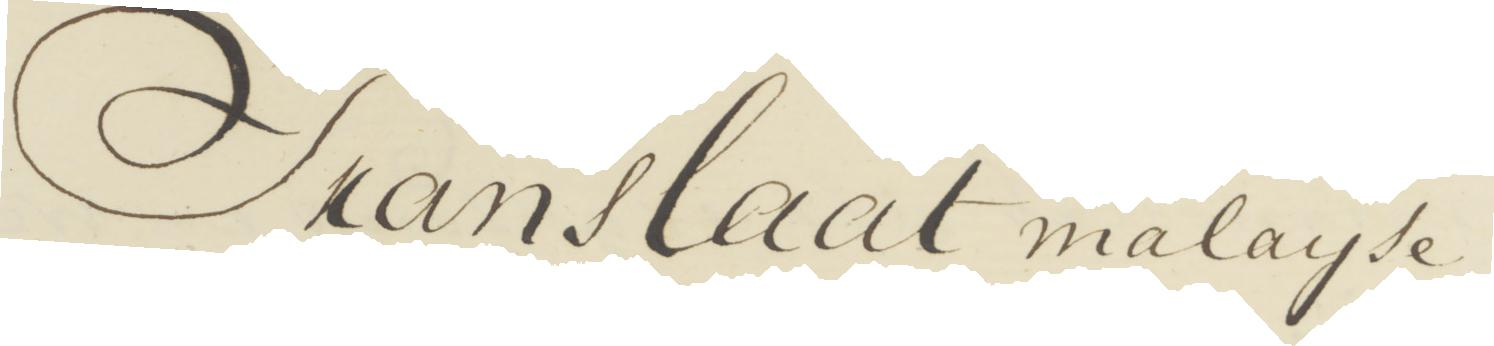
Translaat malaijse
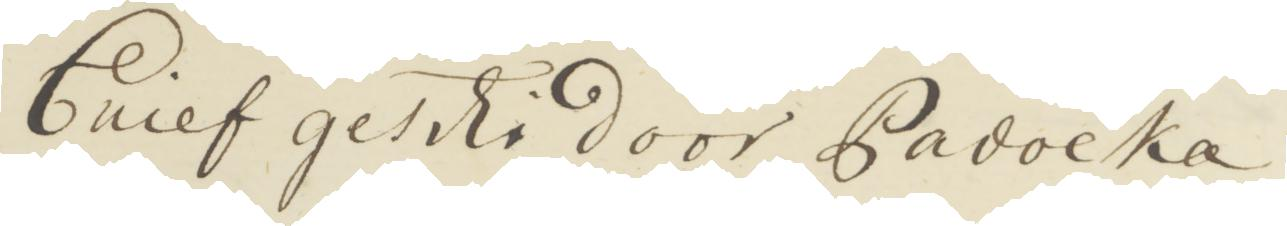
brief gesch: door Padoeka
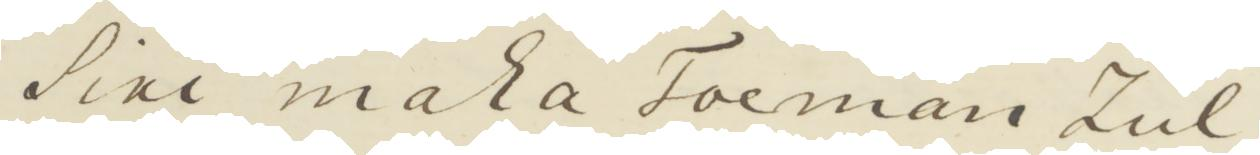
siri maha Toeman zul
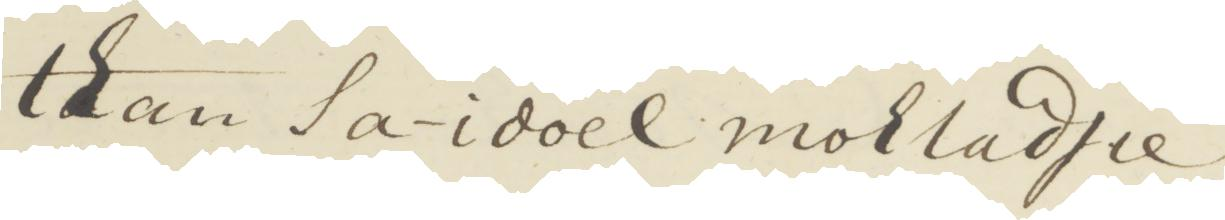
than sa-idoel mohtadjie
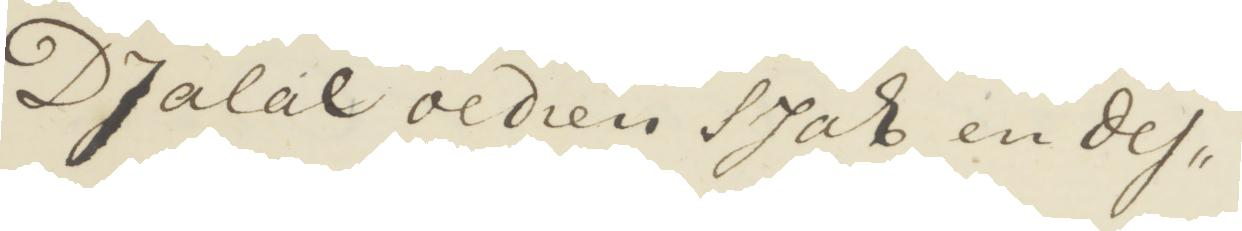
Djalal oedien sjah en des„
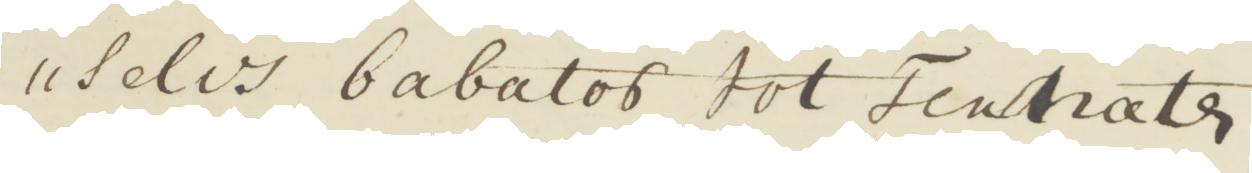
„selvs babatos tot Ternaten
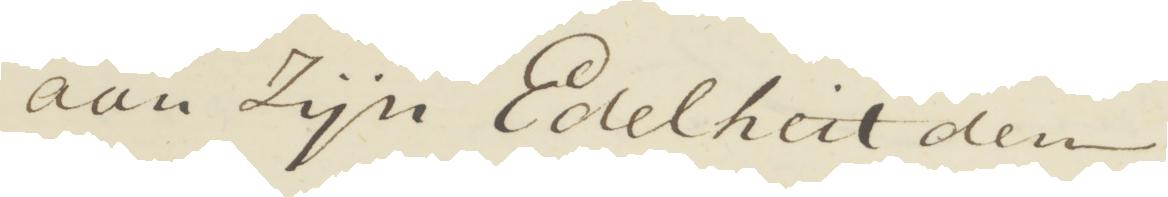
aan zijn Edelheit den
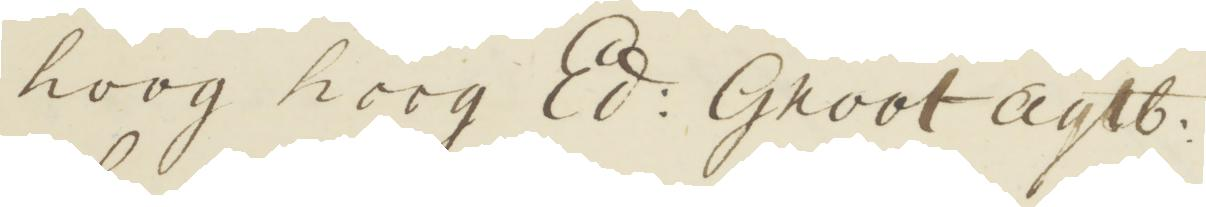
hoog hoog Ed: Groot agtb:
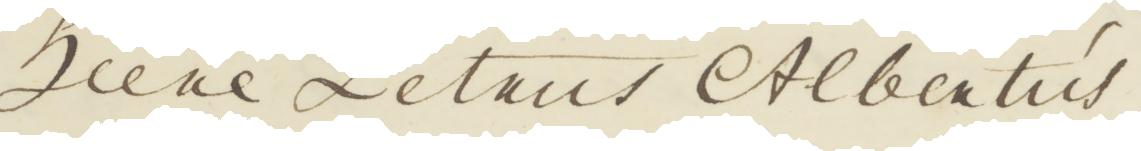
Heere Petrus Albertus
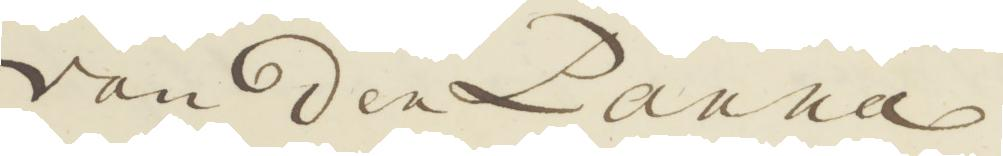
van der Parra
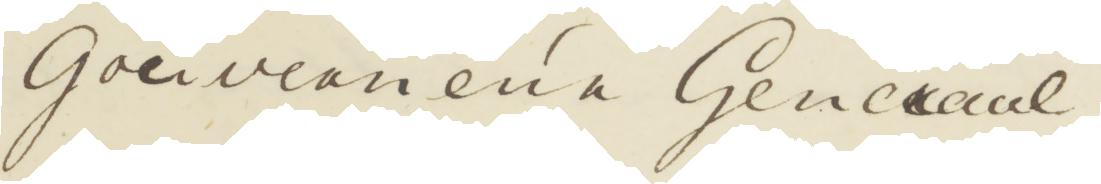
gouverneur Generaal
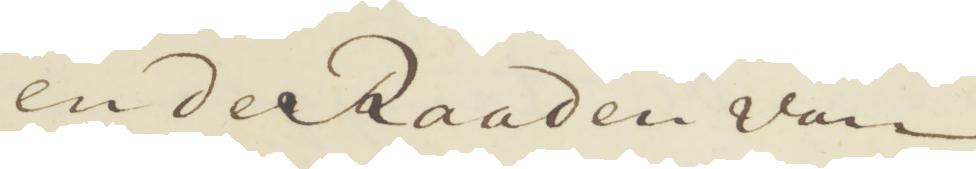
en de Raaden van
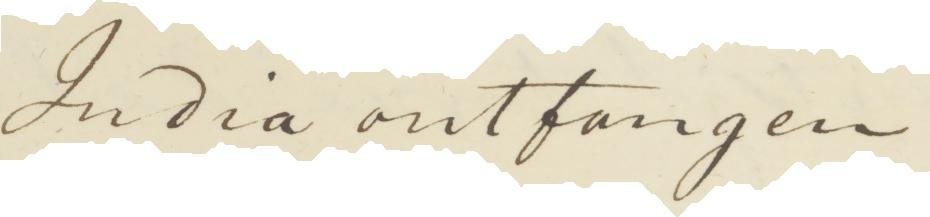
India ontfangen
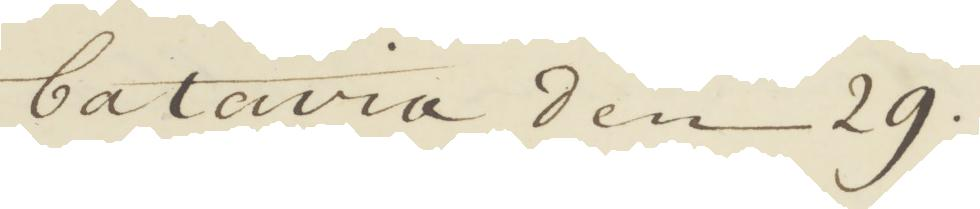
batavia den 29.
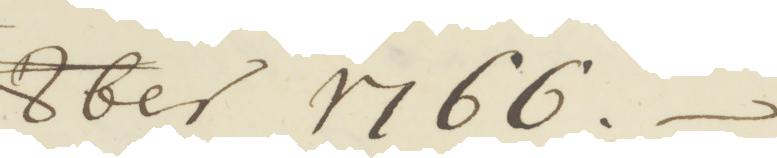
8ber 1766. —
